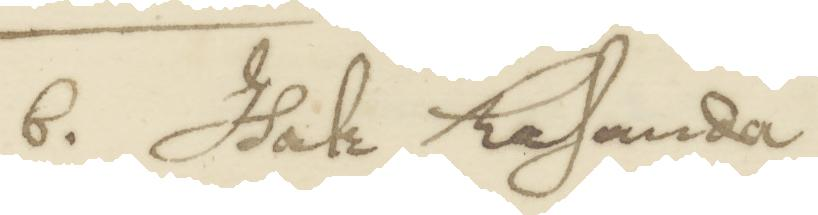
b. Isak kasanda
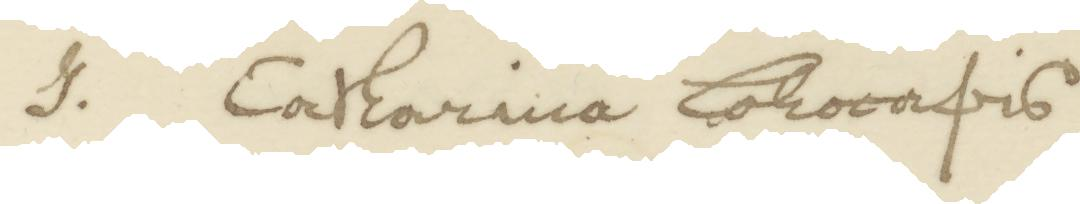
I. Catharina Lokocapis
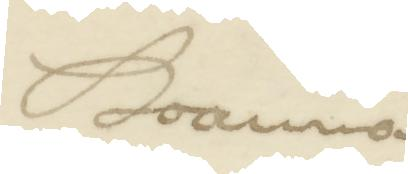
Hoanna
